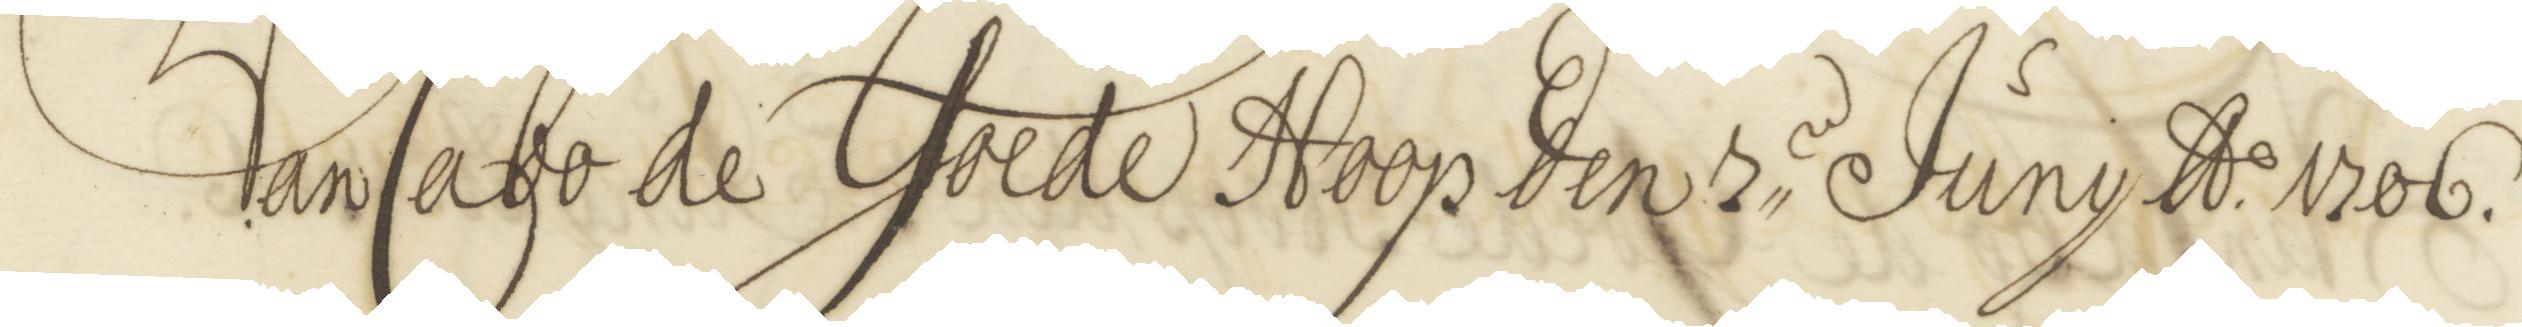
Van Cabo de Goede Hoop den 7„e Junij A.o 1706.
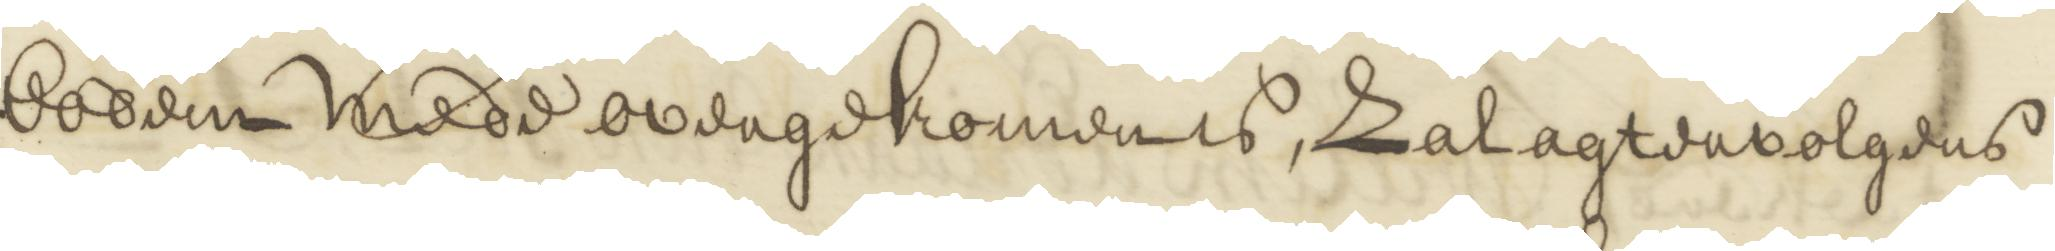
bodem mede overgekomen is, zal agtervolgens
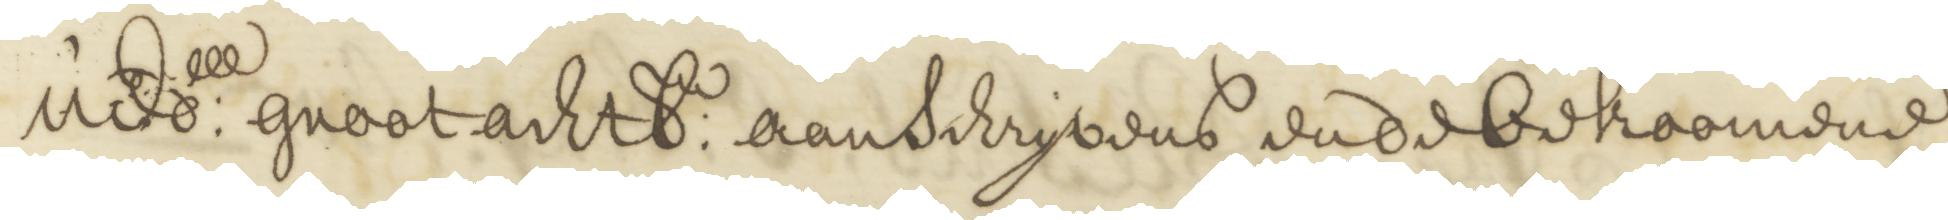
uEd:ele groot achtb: aanschrijvens en de bekoomene
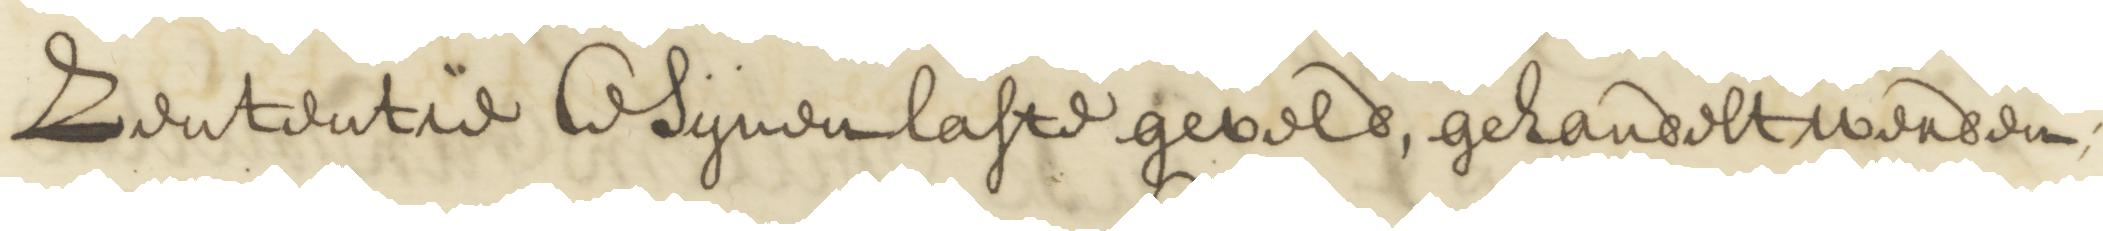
zententie te sijnen laste geveld, gehandelt werden;
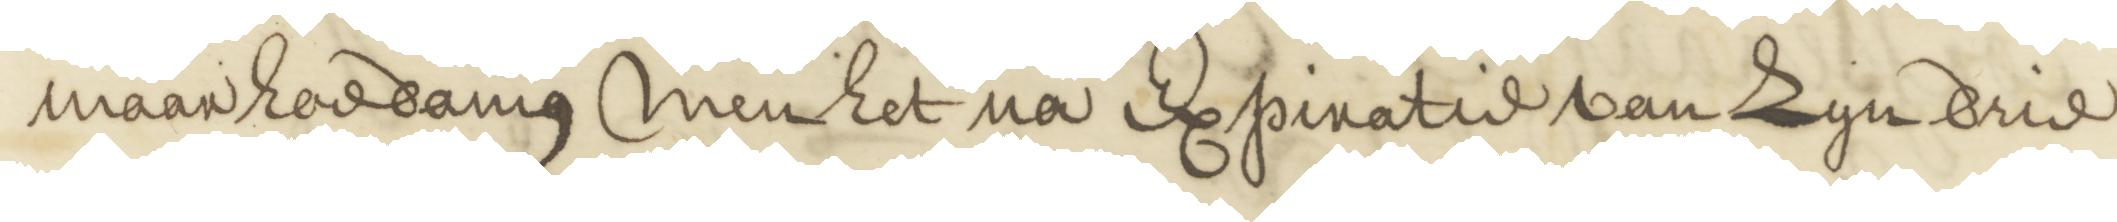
maar hoedanig men het na Expiratie van zijn drie
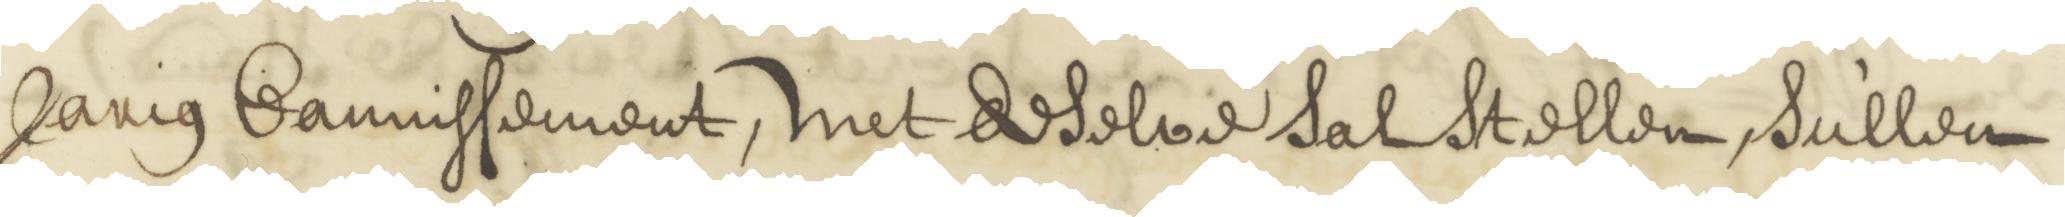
jarig bannissement, met deselve sal stellen, sullen
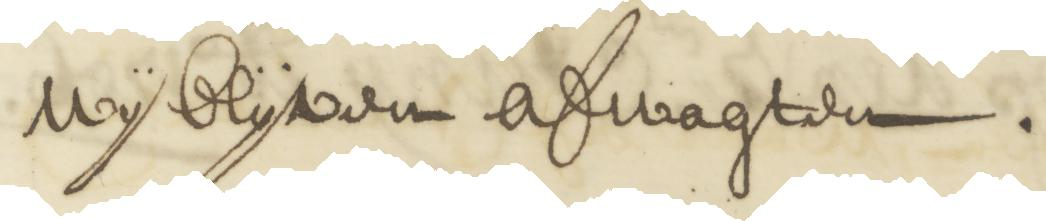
wij blijven afwagten.
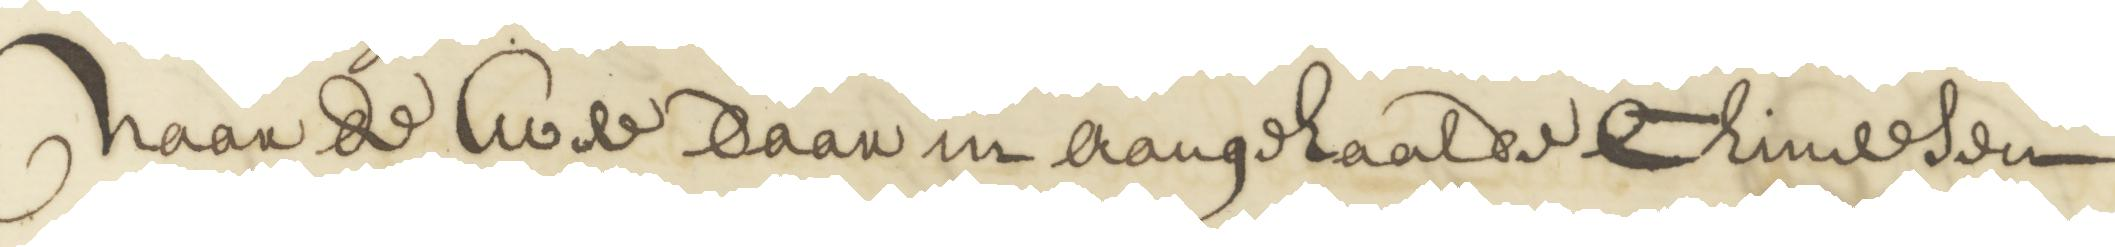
naar de twee daar in aangehaalde Chineesen
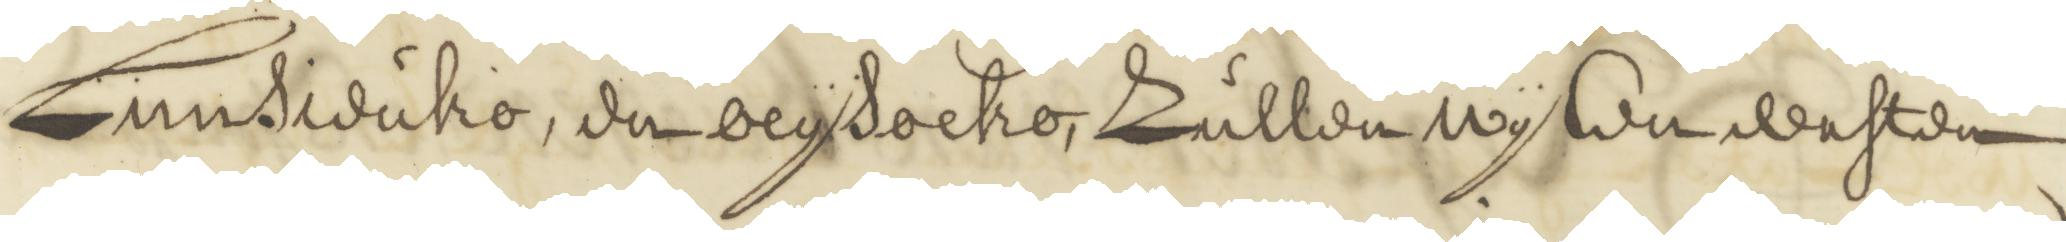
Cunsieuko, en oeijsoeko, zullen wij ten eersten
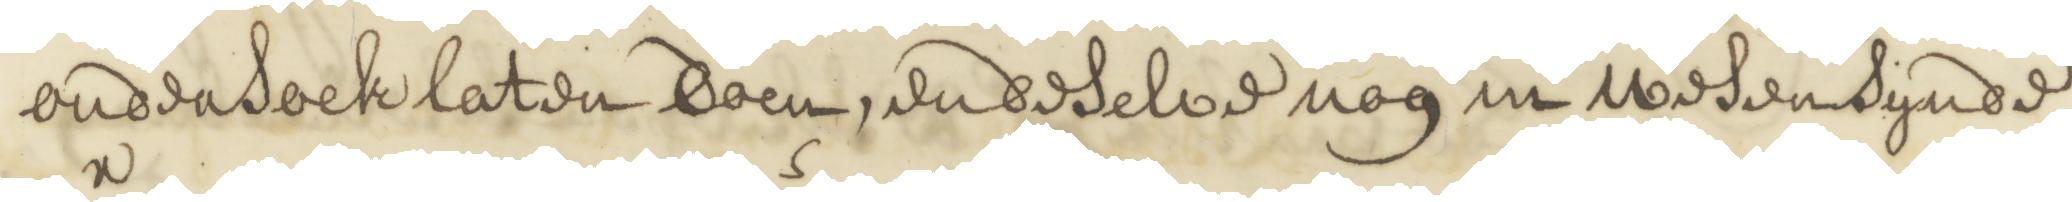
ondersoek laten doen, en deselve nog in wesen sijnde
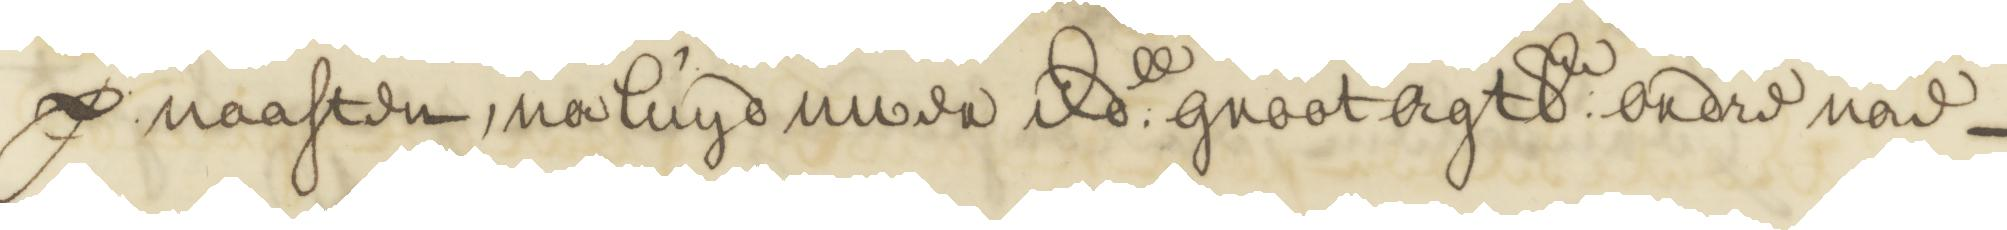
p:r naasten, na luyd uwer Ed:e groot agtb: ordre nae _
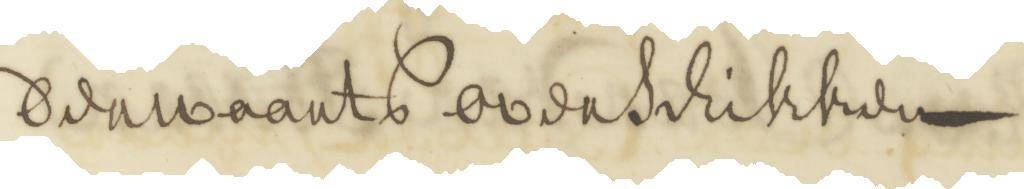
derwaarts overschikken.
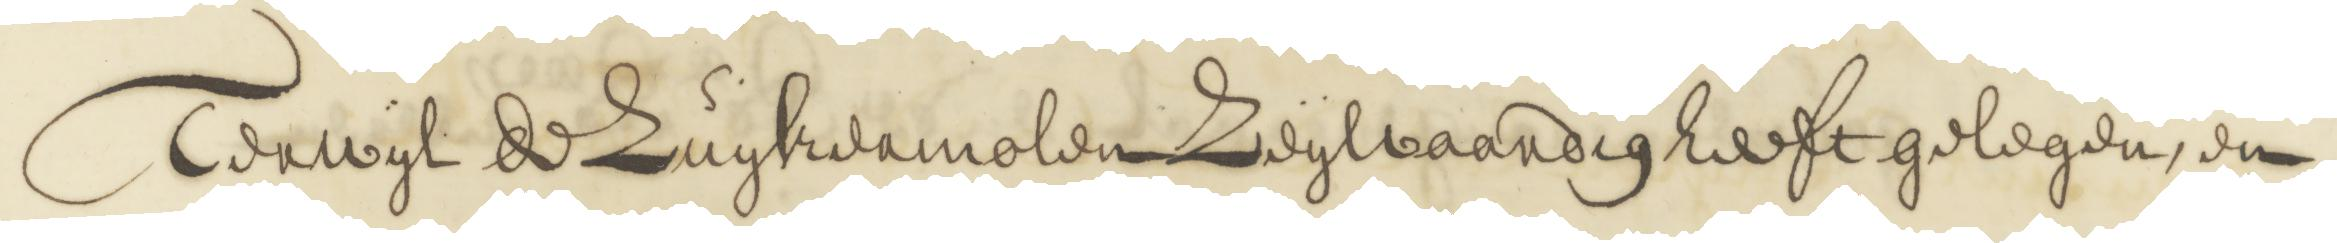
Terwijl de Zuykermolen Zeijlvaardig heeft gelegen, en
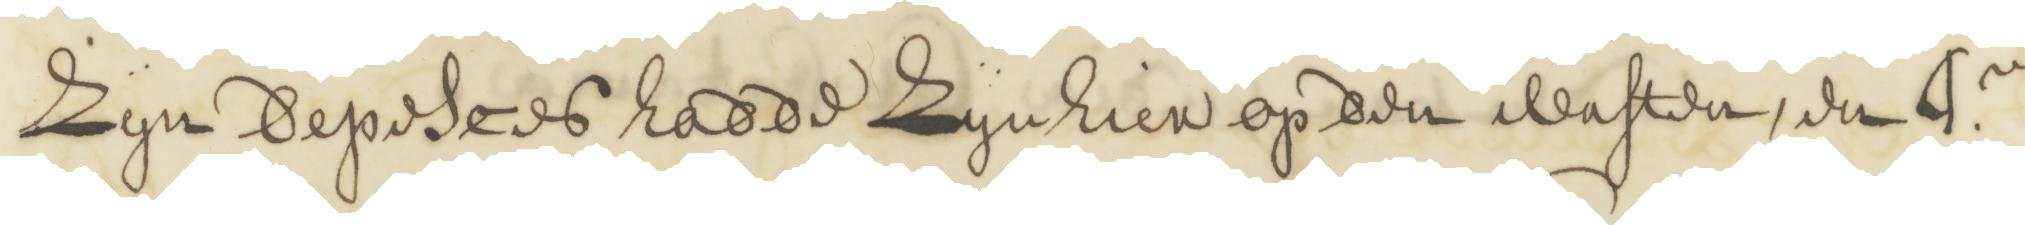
zijn depesces hadde zijn hier op den eersten, en 4.e
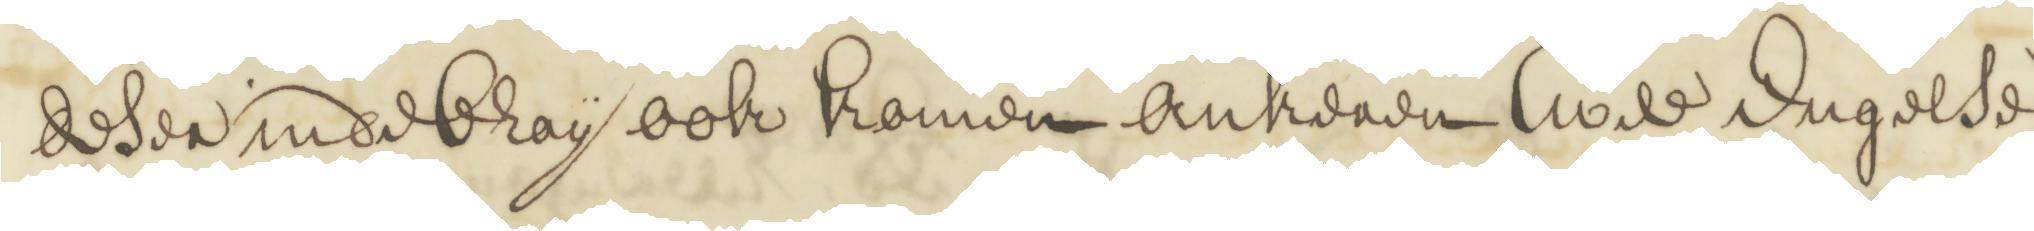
deser in de bhaij ook komen ankeren twee Engelse
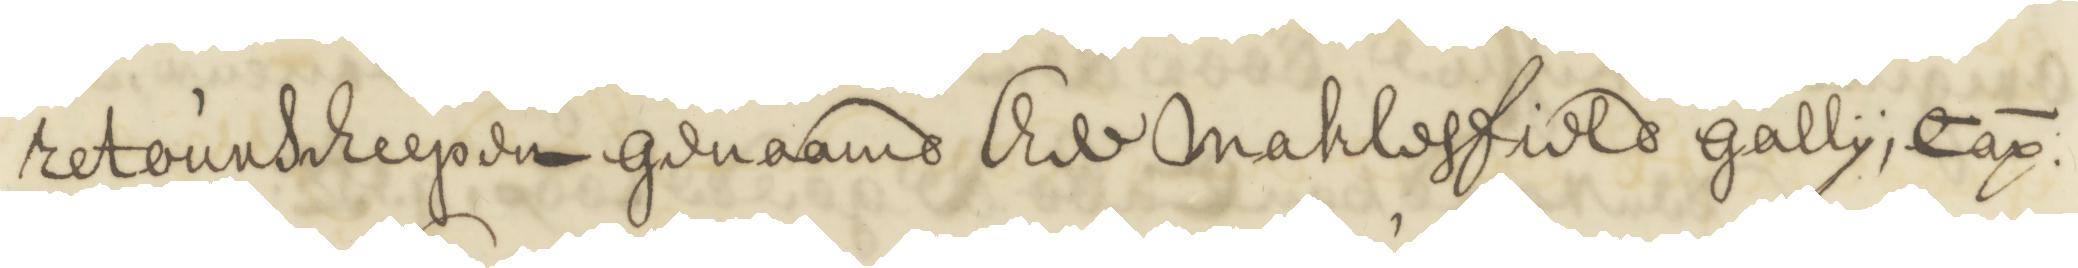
retourscheepen genaamd thee maklesfield gallij, Cap:
